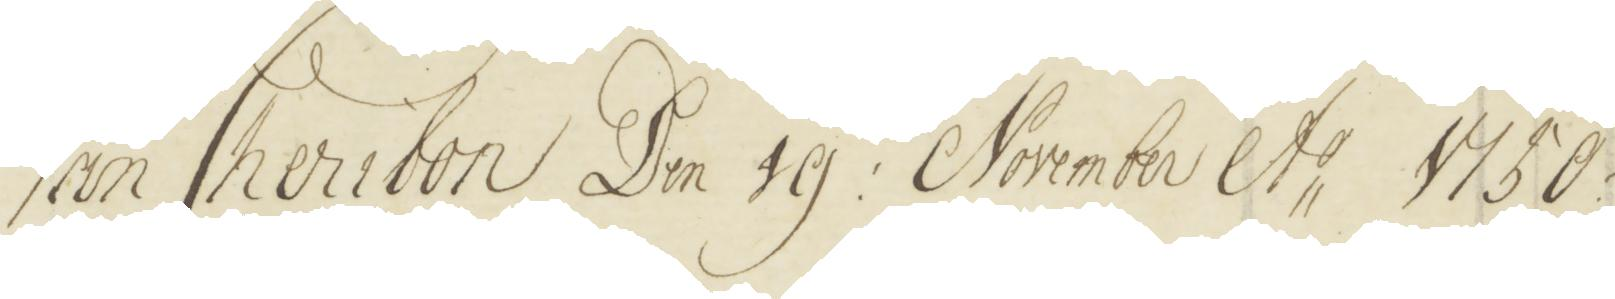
Van Cheribon Den 19:e November A„o 1750:
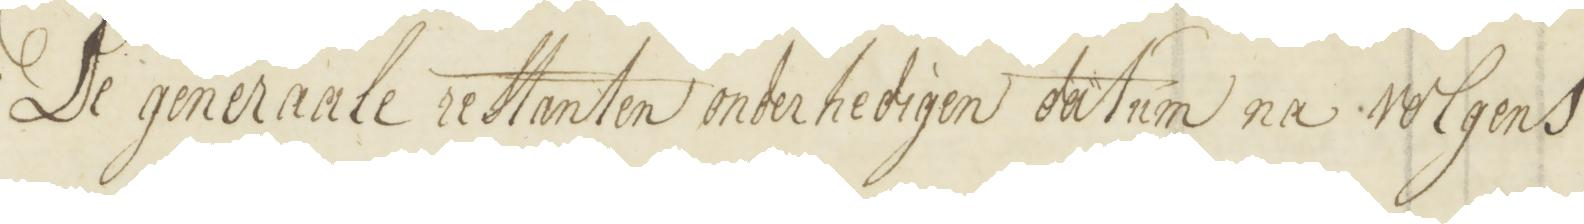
De generaale restanten onder hedigen datum na volgens
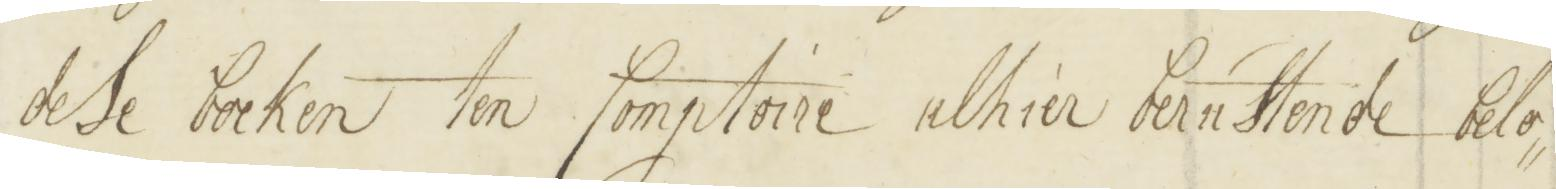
dese boeken ten Comptoire alhier berustende belo„
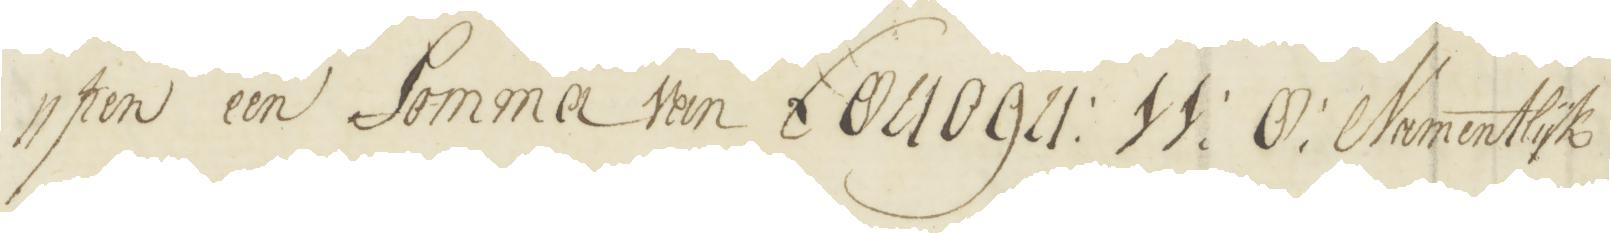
„pen een somma van ƒ84094: 11: 8: Namentlijk
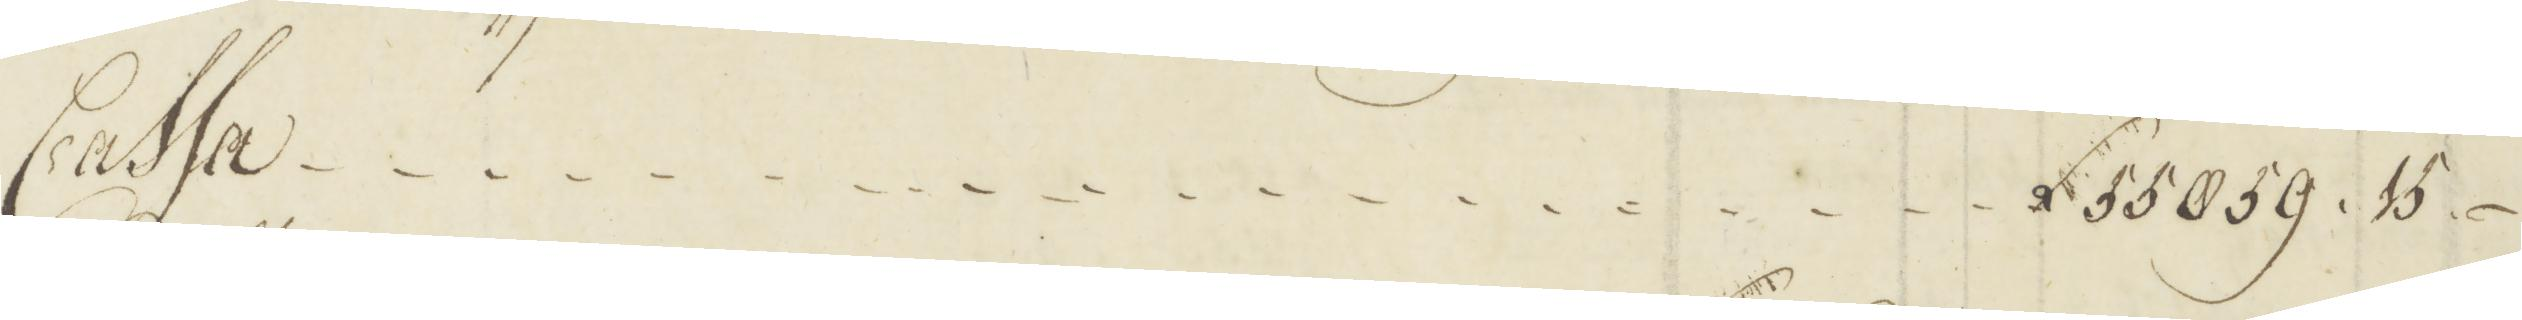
Cassa _ _ _ _ _ _ _ _ _ _ _ _ _ _ _ _ = _ _ _ _ ƒ55859. 15. —
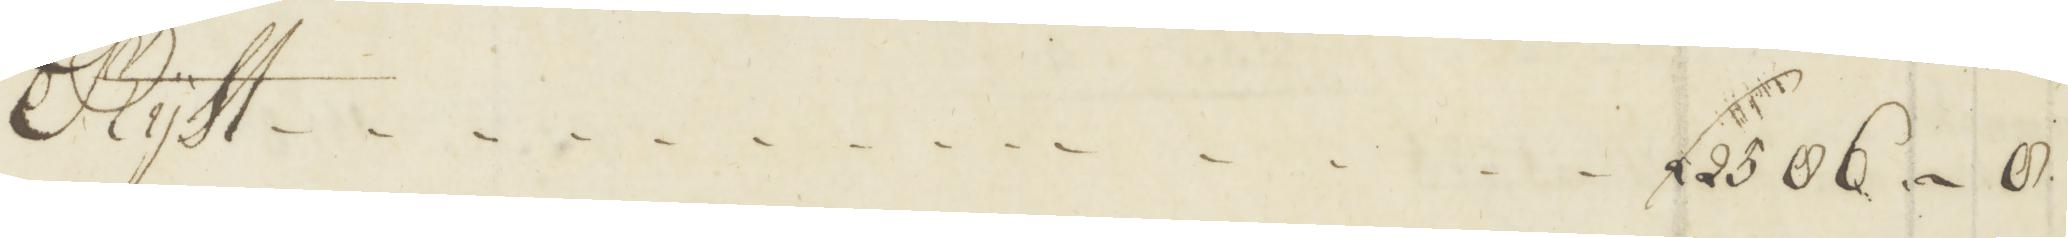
Rijst _ _ _ _ _ _ _ _ _ _ _ _ _ _ ƒ2586: .— 8.
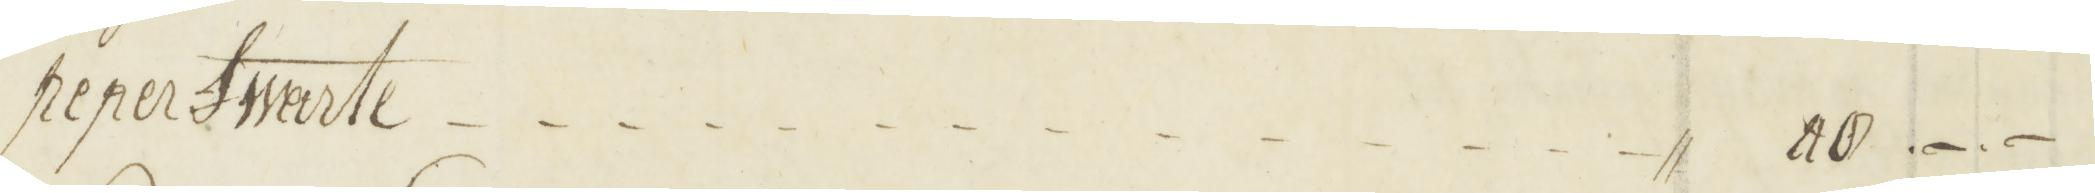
peper swarte _ _ _ _ _ _ _ _ _ _ _ _ „ 48. —. —
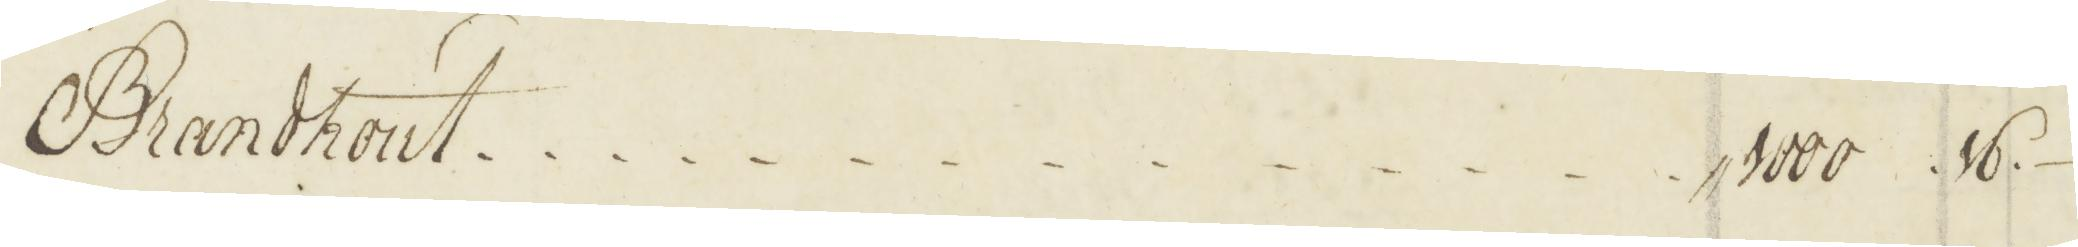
Brandhout _ _ _ _ _ _ _ _ _ _ _ _ _ _ „ 1000. 16. —
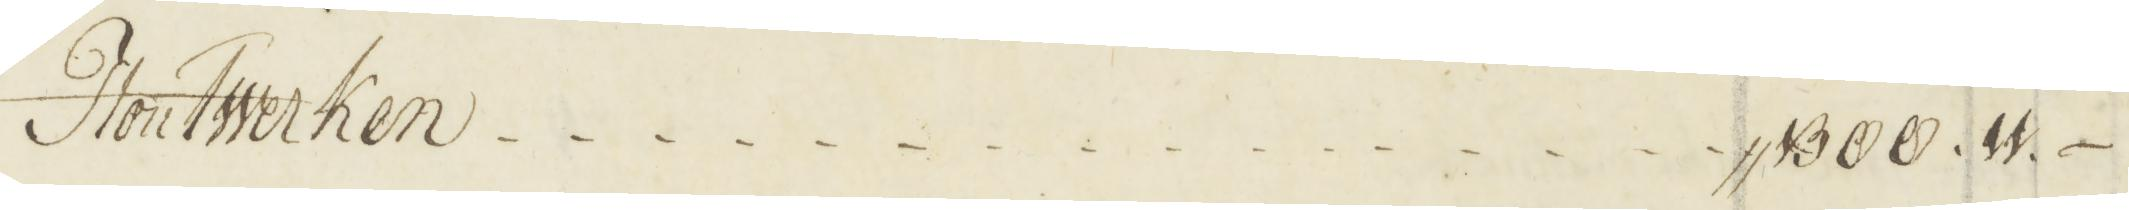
Houtwerken _ _ _ _ _ _ _ _ _ _ _ _ _ _ _ _„ 1388. 11. —
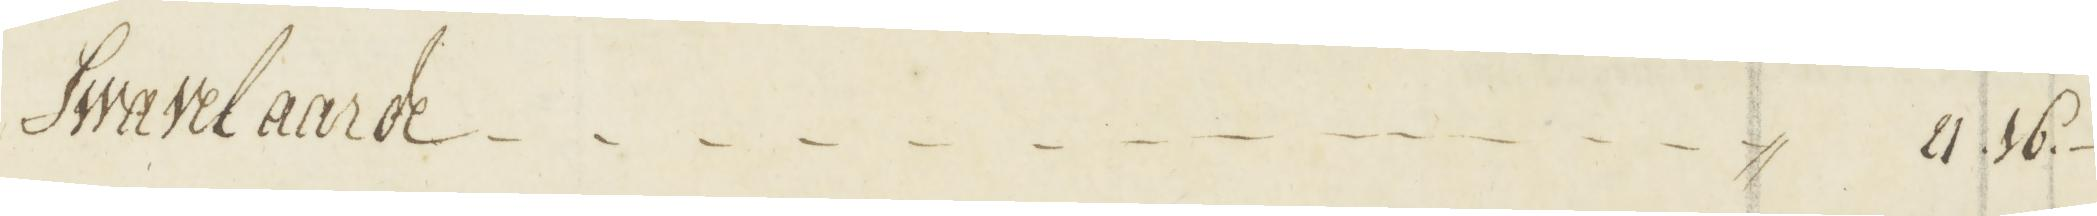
swavel aarde _ _ _ _ _ _ _ _ _ _ _ _ _ _„ 4. 16. —
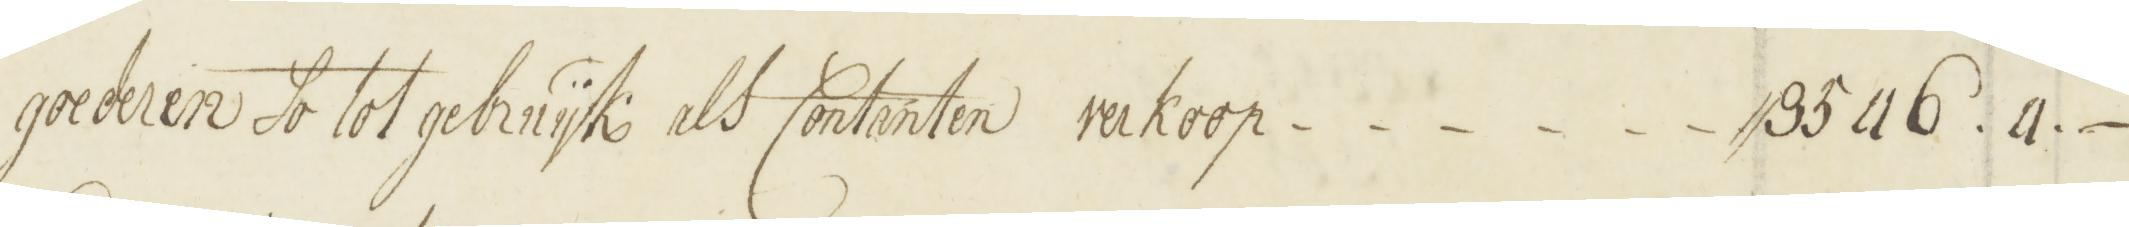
goederen so tot gebruijk als Contanten verkoop _ _ _ _ _ _„ 3546. 4. —
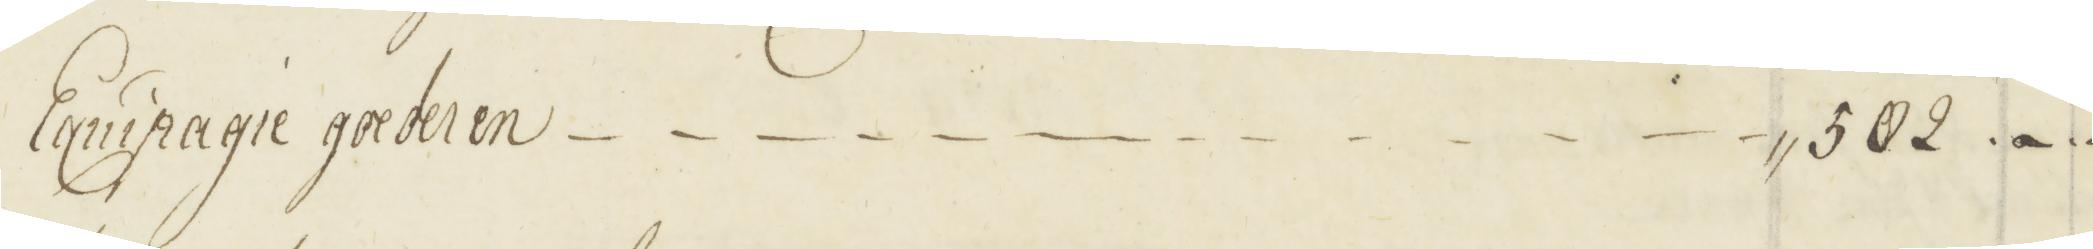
Equipagie goederen _ _ _ _ _ _ _ _ _ _ _ _ _ „ 582. —.
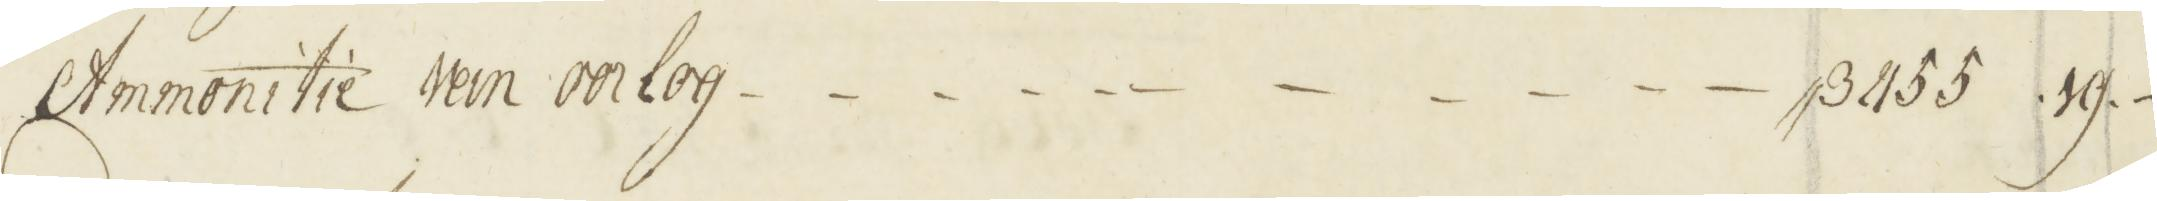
Ammonitie van oorlog _ _ _ _ _ _ _ _ _ _ _„ 3455. 19. —
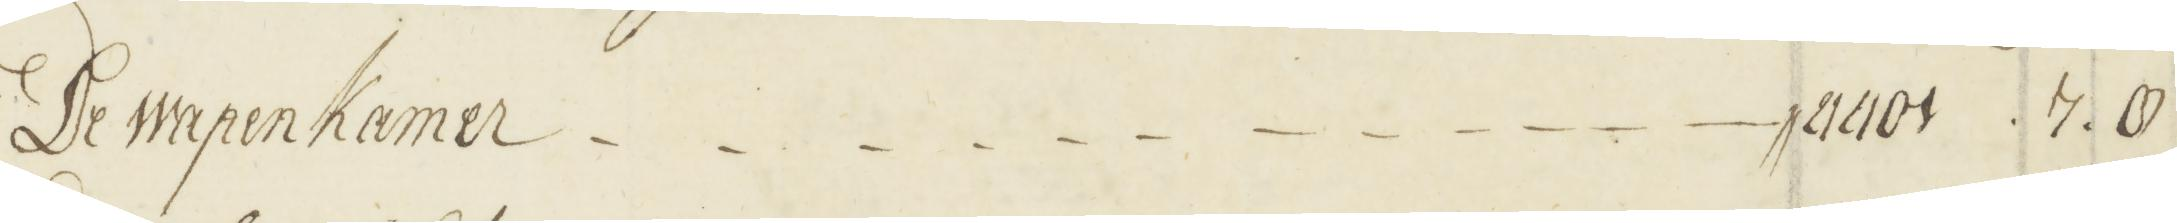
De wapen kamer _ _ _ _ _ _ _ _ _ _ _ _ „ 4401. 7. 8
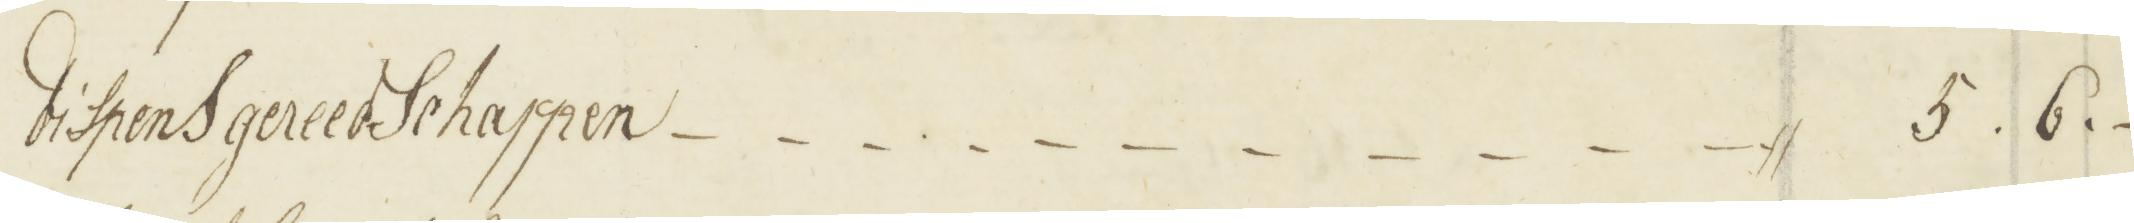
dispens gereedschappen _ _ _ _ _ _ _ _ _ _ _„ 5. 6. —
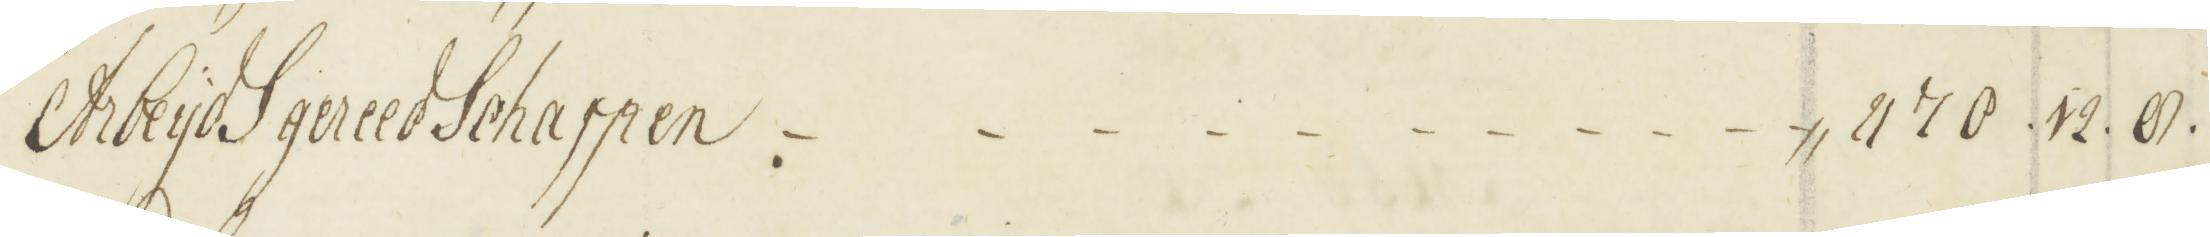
Arbeijds gereedschappen _ _ _ _ _ _ _ _ _ _ _„ 478. 12. 8.
